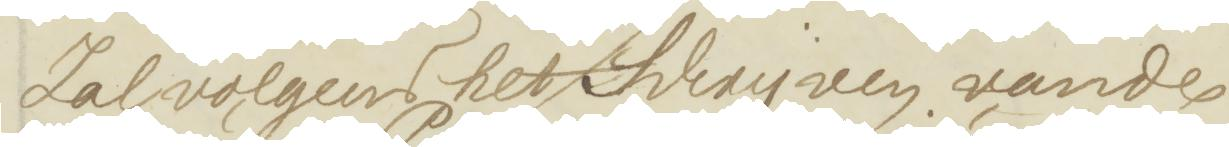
zal volgens het schrijven vande
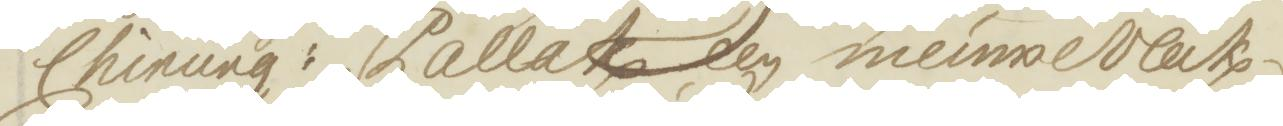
Chirurg: Pallak een nieuw vlak
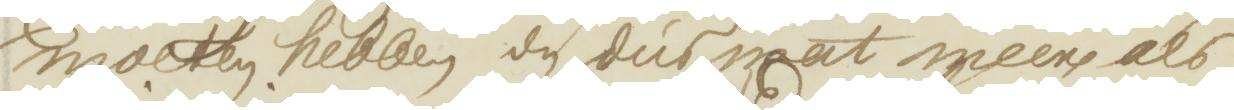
moeten hebben en dus wat meer als
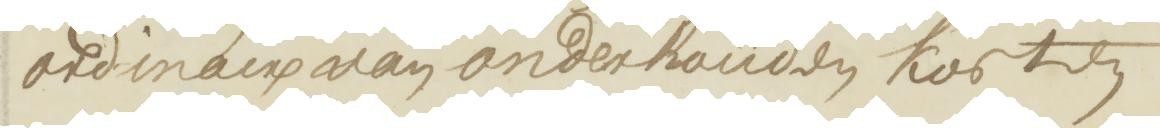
ordinair van onderhouden kosten
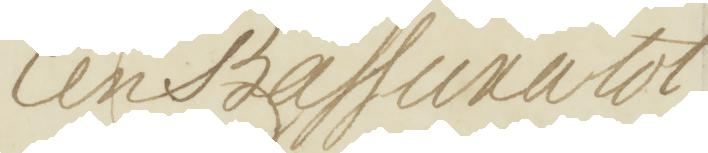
Een Bassura tot
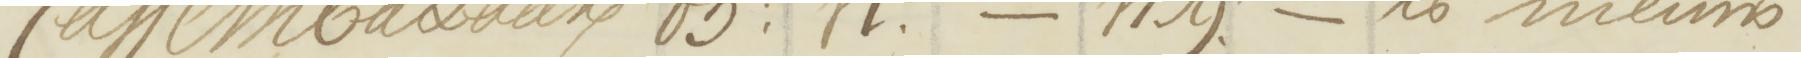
Cassembazaar 85: 11: — 1739: — is nieuw
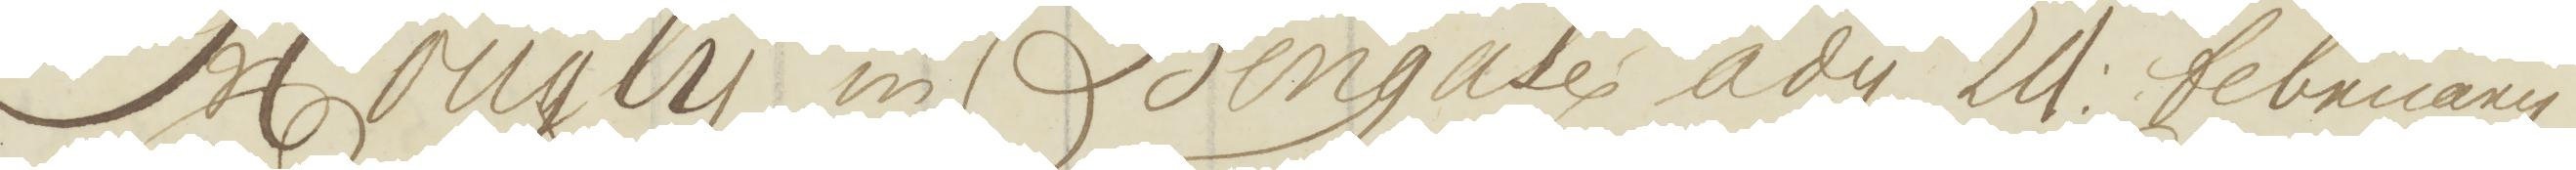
Houglij in Bengale adij 24: februarij
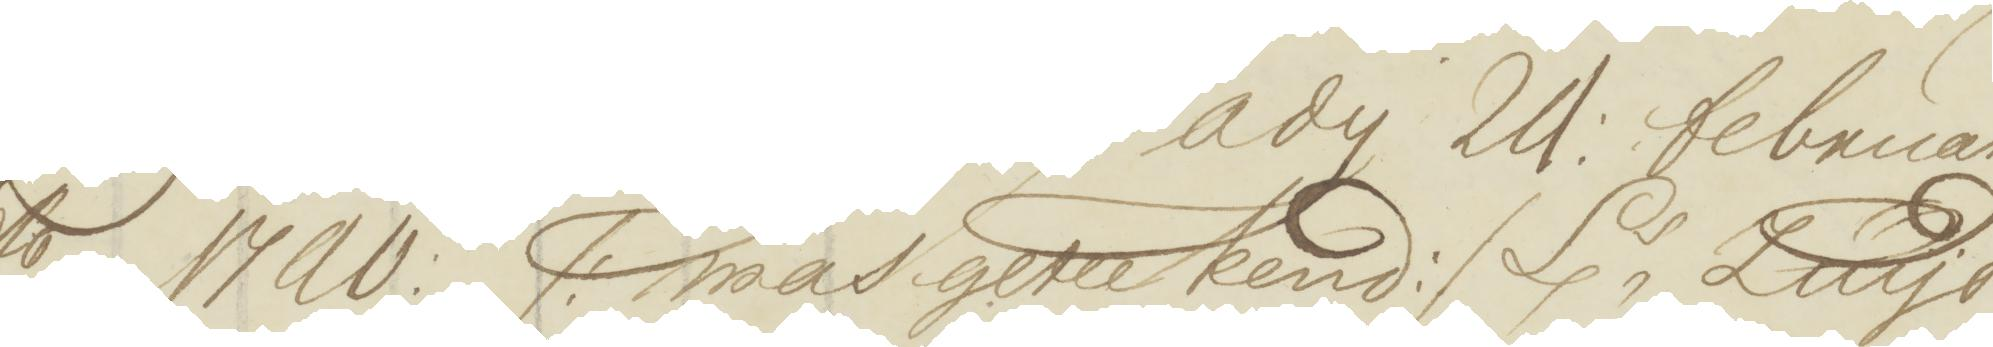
A„o 1740: /:was geteekend:/ L„s zuijd
